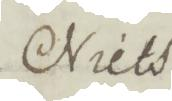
Niets
